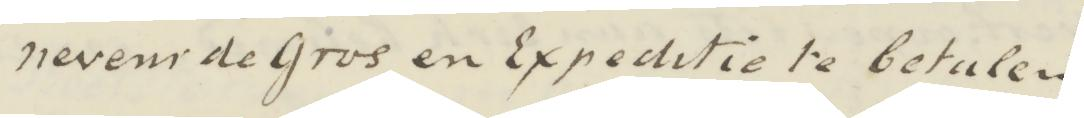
nevens de Gros en Expeditie te betalen
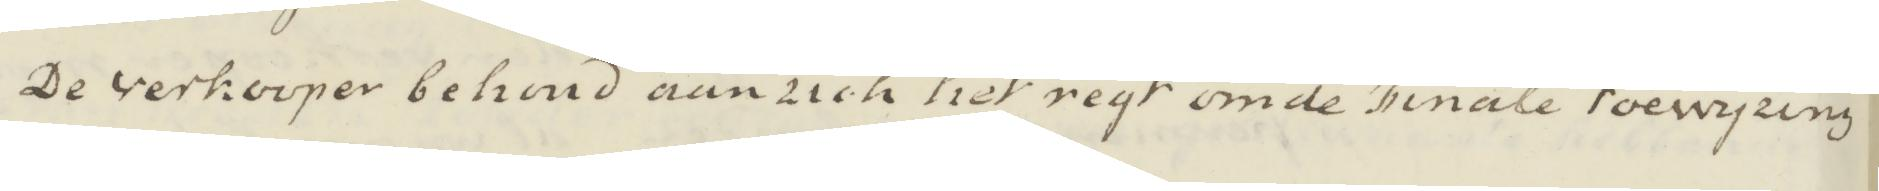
De verkooper behoud aan zich het regt om de Finale toewyzing
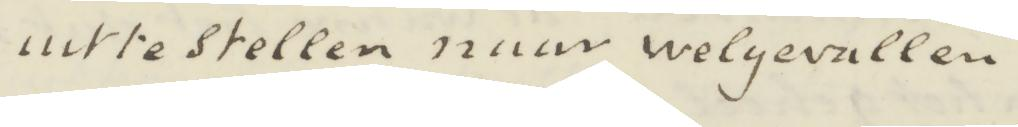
uit te stellen naar welgevallen
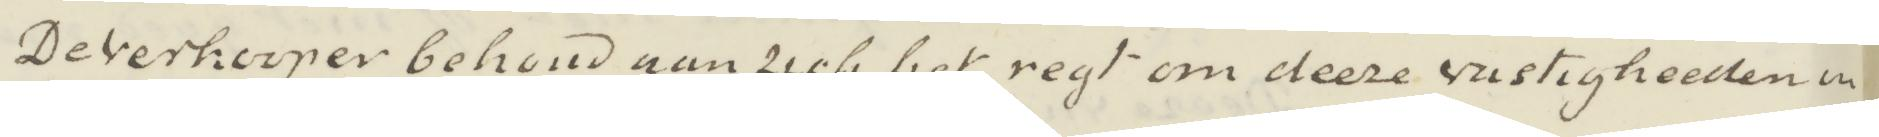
De verkooper behoud aan zich het regt om deeze vastigheeden in
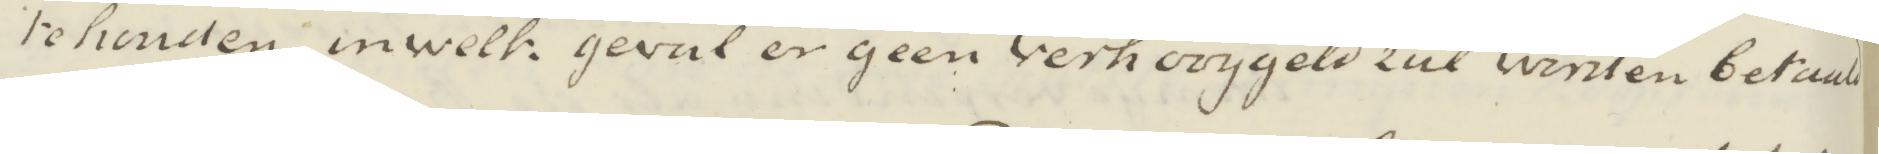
te houden in welk geval er geen verhooggeld zal worden betaald
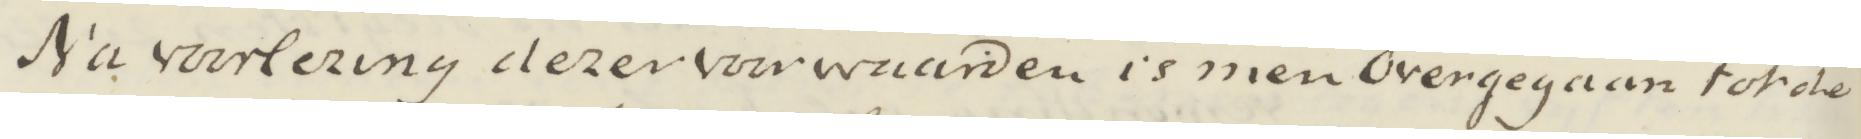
Na voorlezing dezer voorwaarden is men overgegaan tot de
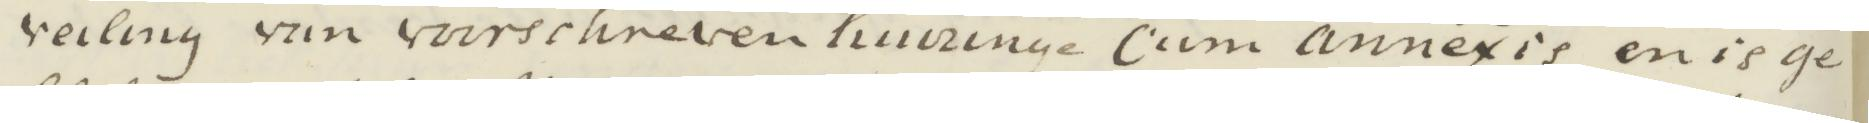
veiling van voorschreven huizinge Cum annexis en is ge
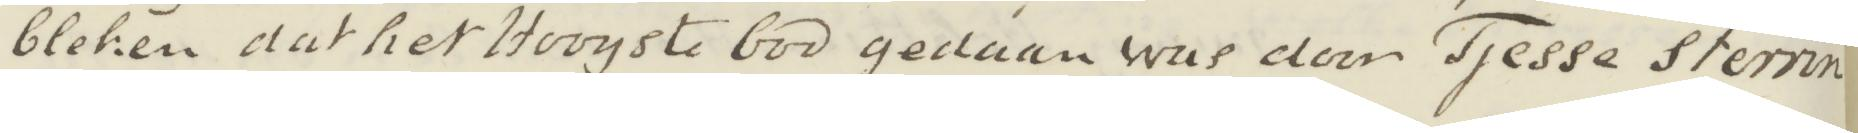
bleken dat het Hoogste bod gedaan was door Tjesse Sterrin
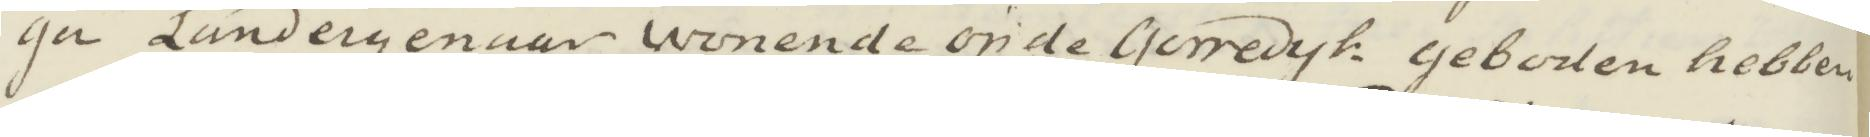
ga Landeigenaar wonende op de Gorredyk geboden hebben
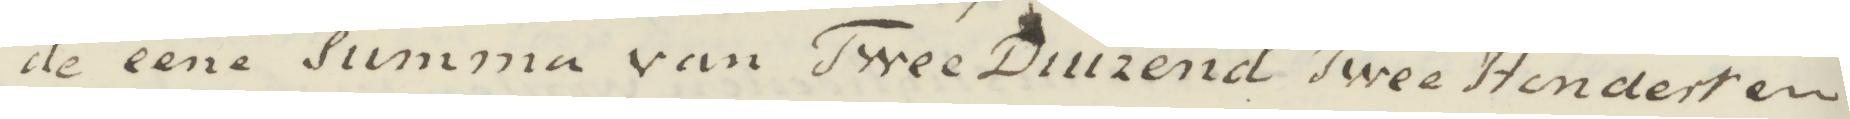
de eene summa van Twee Duizend Twee Hondert en
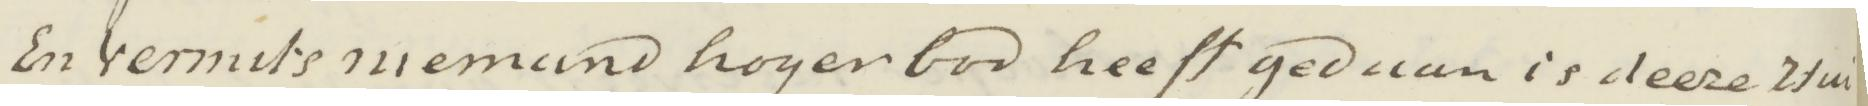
En vermits niemand hoger bod heeft gedaan is deeze Hui
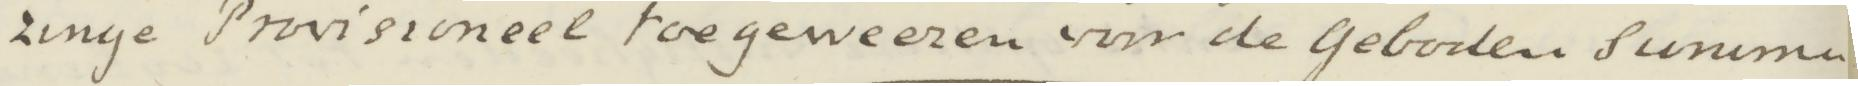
zinge Provisioneel toegeweezen voor de geboden summa
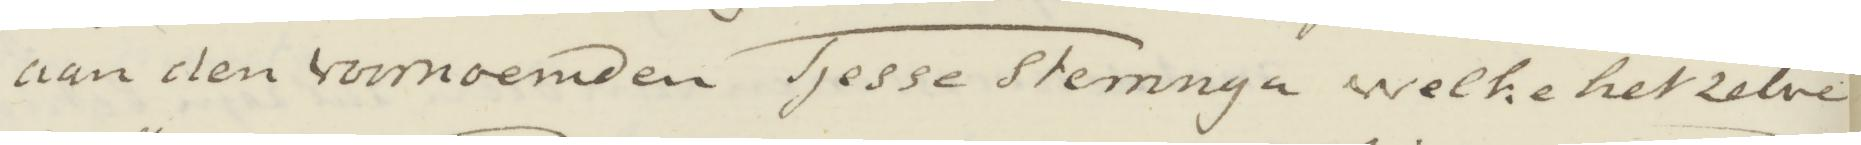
aan den voornoemden Tjesse Sterringa welke het zelve
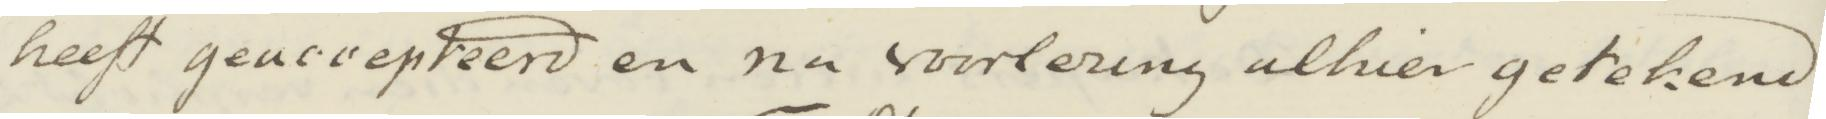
heeft geaccepteerd en na voorlezing alhier getekend
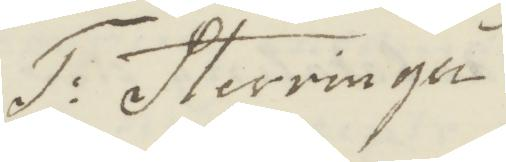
T: Sterringa
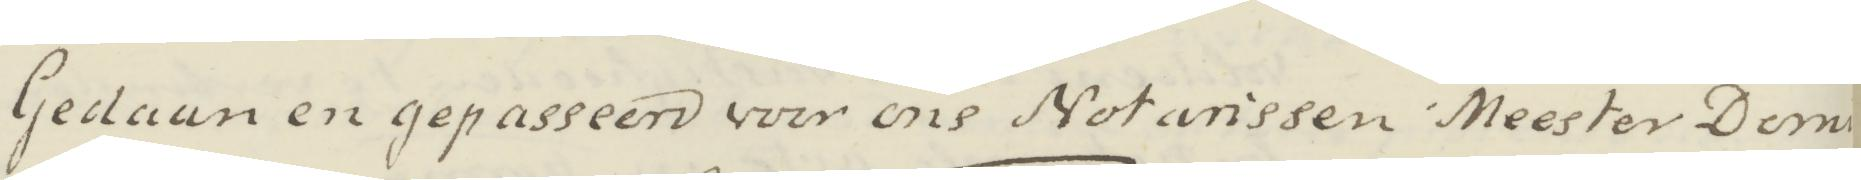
Gedaan en gepasseerd voor ons Notarissen Meester Domi
